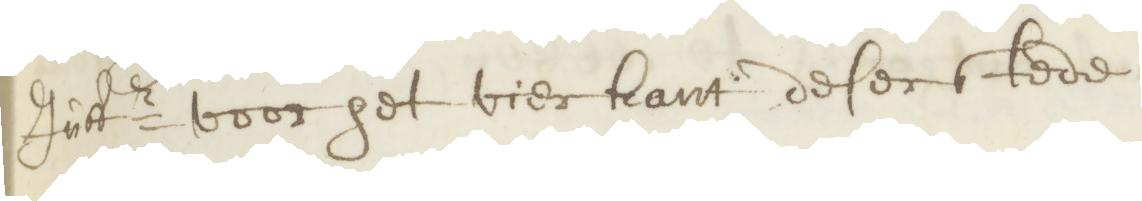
Juff=r voor het vier kant deser stede
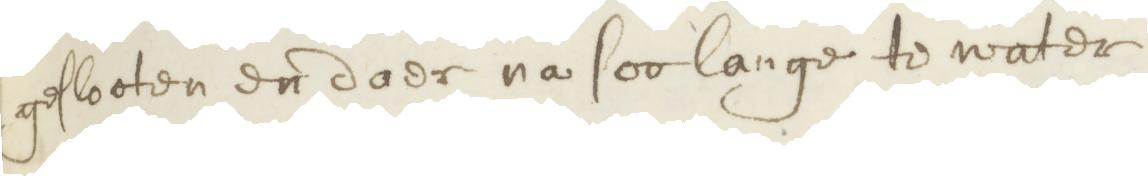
geslooten en daer na soolange te water
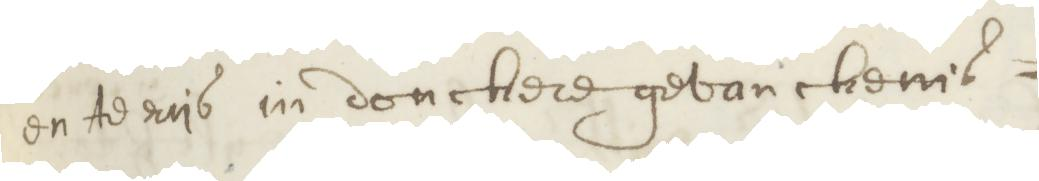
en te rijs in donckere gevanckenis
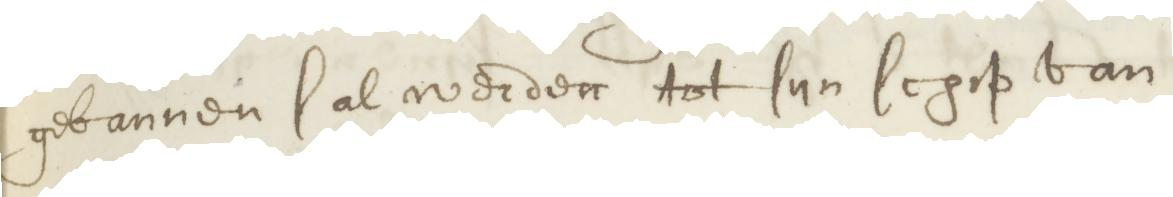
gebannen sal werden tot syn schip van
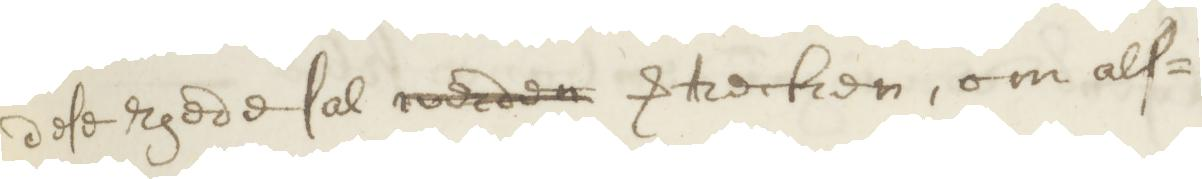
dese rhede sal werden vertrecken, om als=
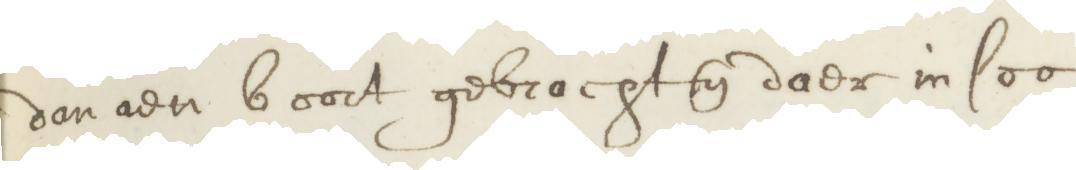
dan aen boort gebrocht ende daer in soo
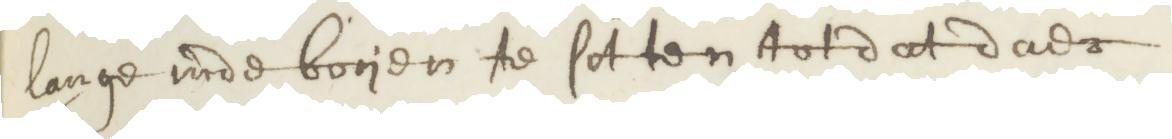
lange inde boijen te sitten tot dat daer
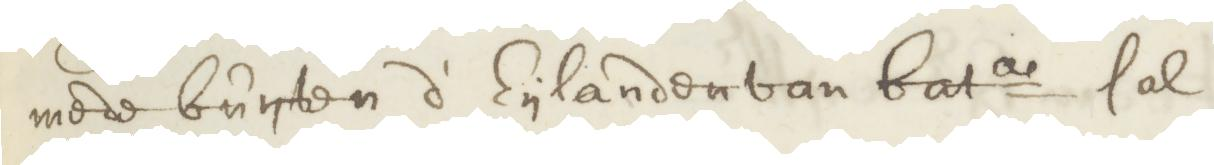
mede buijten d’ Eijlanden van bat=a sal
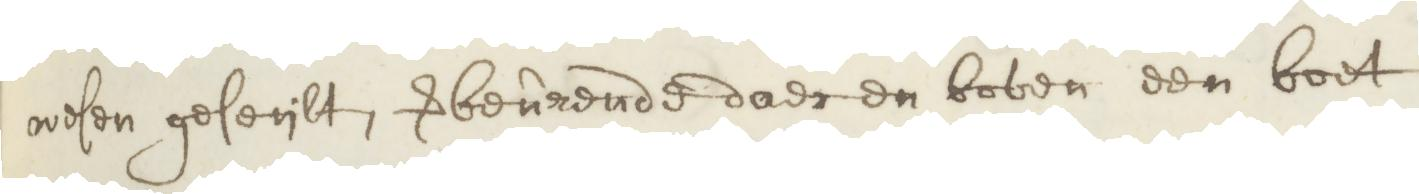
wesen geseijlt, verbeurende daer en boven een boet
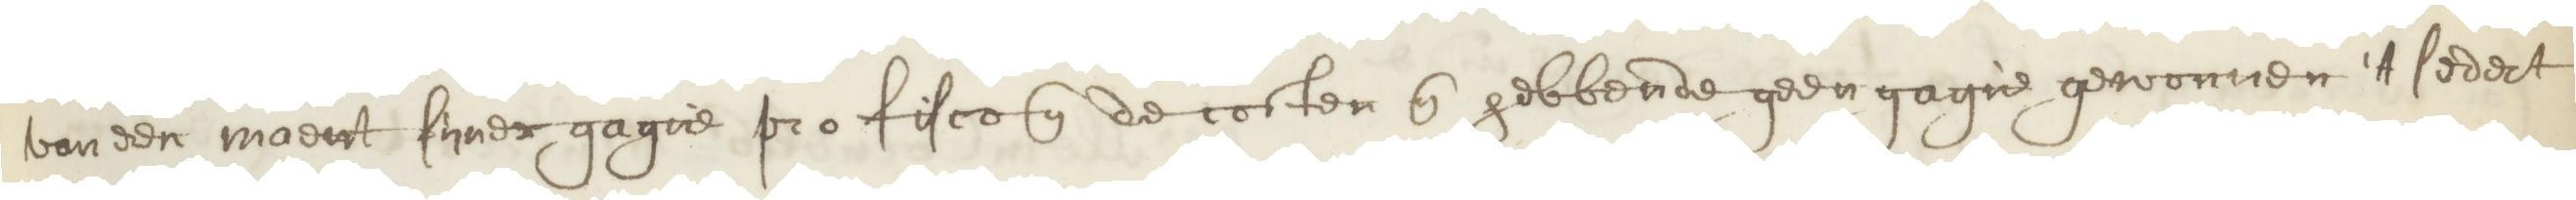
van den maent sijner gagie pro fisco ende de costen ende hebbende geen gagie gewonnen ’t sedert
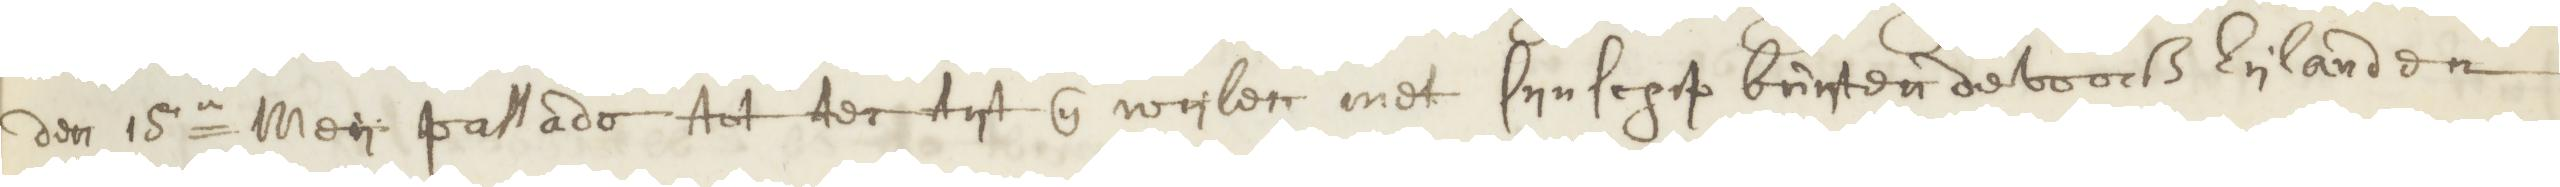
den 15=e Meij passado tot ter tyt ende wijlen met syn schip buyten de voorꞵ Eijlanden
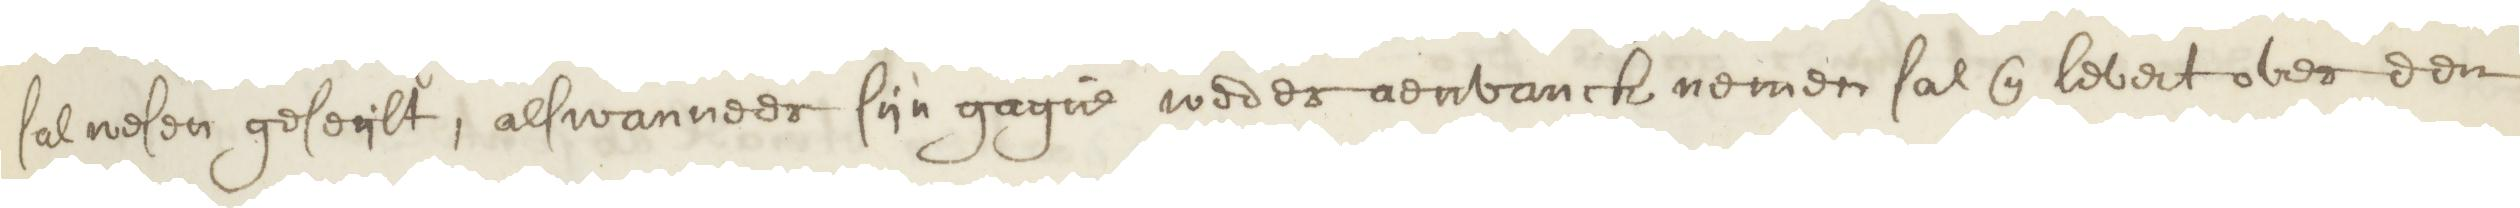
sal wesen geseijlt, als wanneer sijn gagie weder aenvanck nemen sal ende levert over den
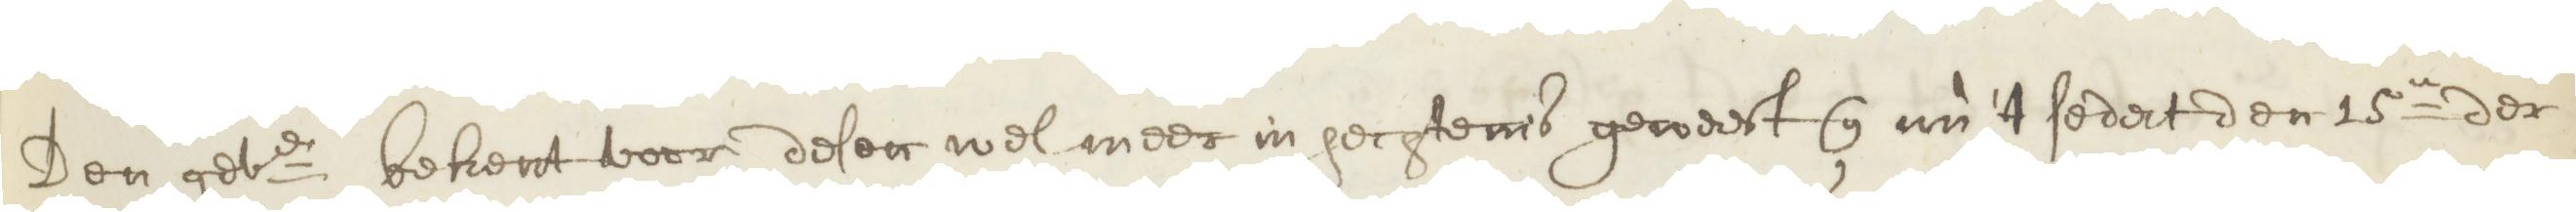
Den gev=e bekent voor desen wel meer in hechtenis geweest ende nu ’t sedert den 15=e der
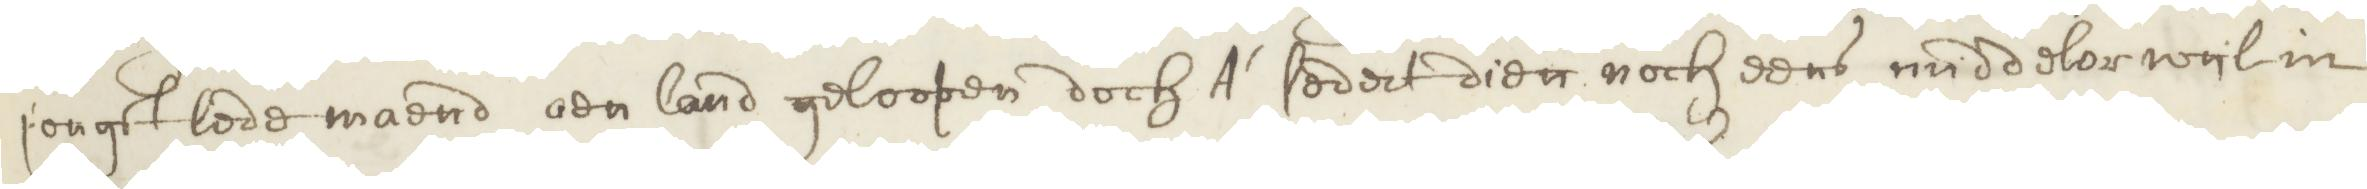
jongst lede maend aen land geloopen doch t' sedert dien noch eens middeler wijl in
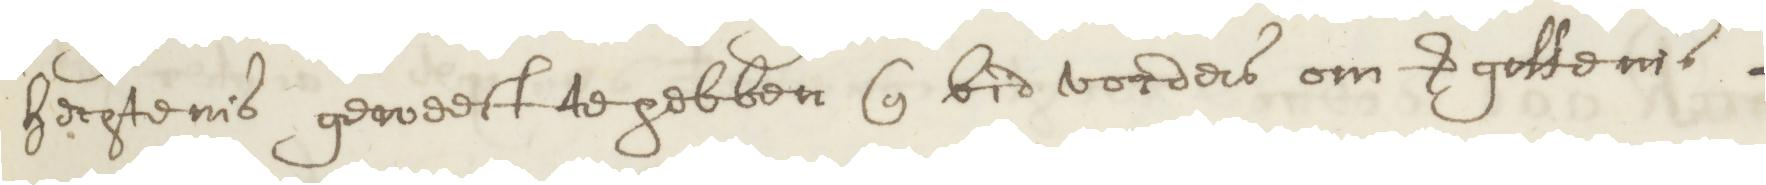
hechtenis geweest te hebben ende bid vorders om vergiffenis.
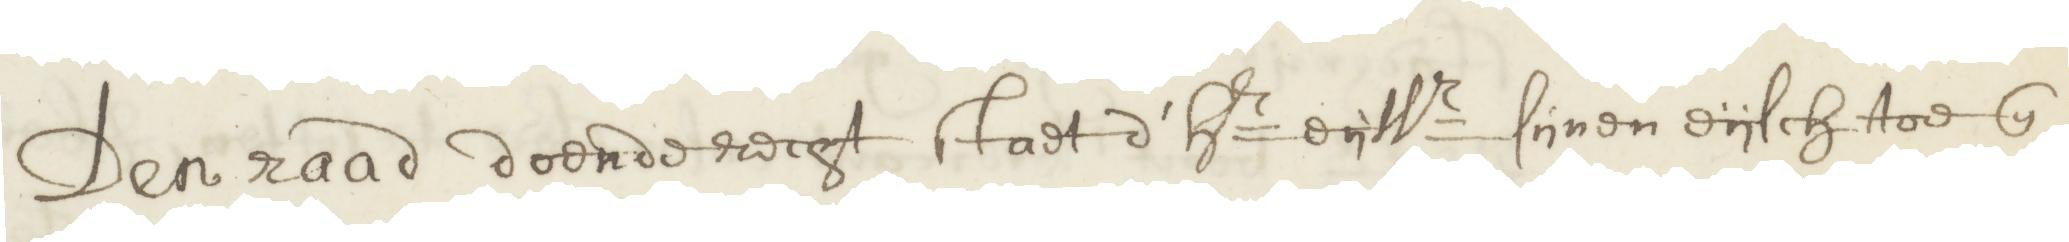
Den raad doende recht staet d’ h=r eijss=r sijnen eijsch toe ende
